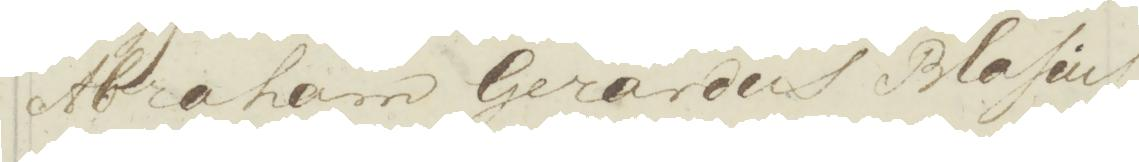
Abraham Gerardus Blasius,
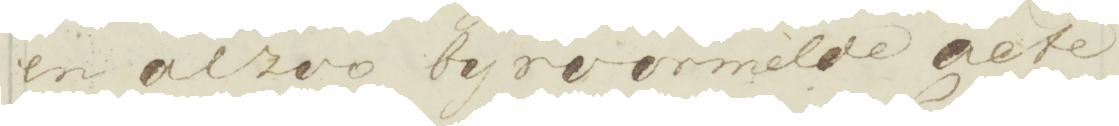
en alzoo by voormelde acte
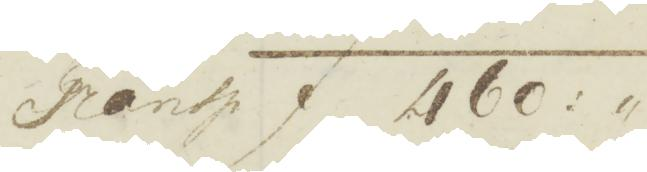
Transp ƒ 460 : „
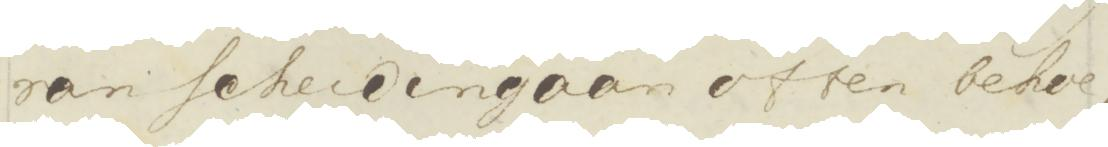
van scheiding aan of ten behoe„
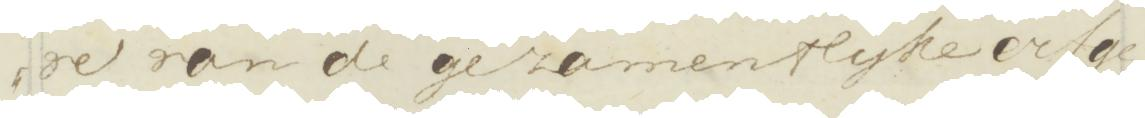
„ve van de gezamentlyke erfge
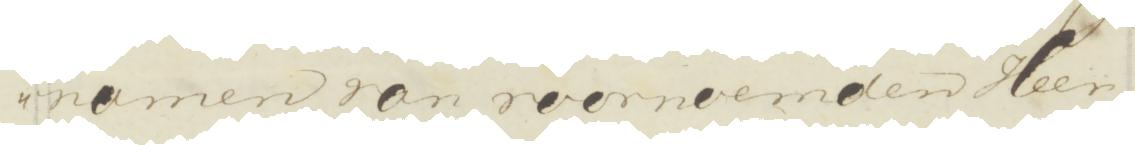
„namen van voornoemden Heer
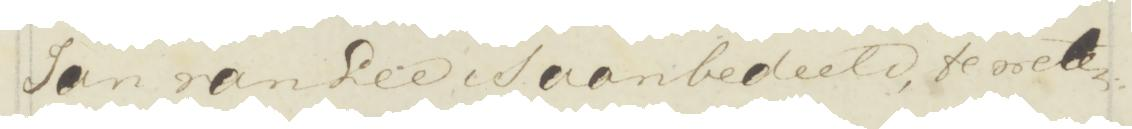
Jan van Lée is aanbedeeld, te weten
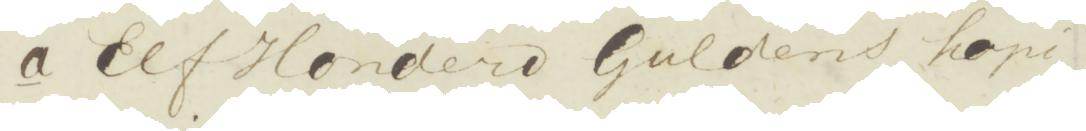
a Elf Honderd Guldens kapi
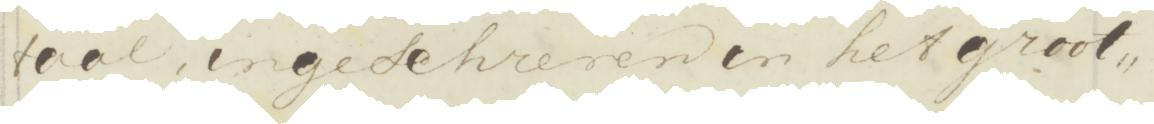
taal, ingeschreven in het groot„
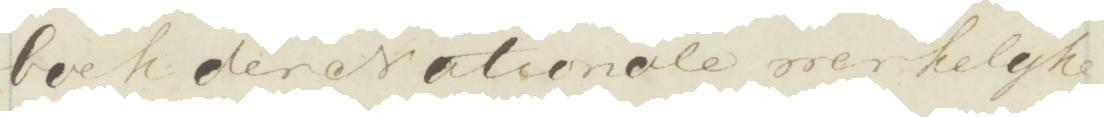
„boek der Nationale werkelyke
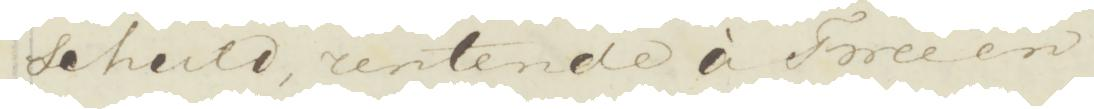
schuld, rentende à Twee en
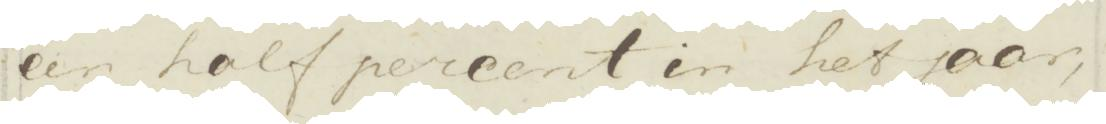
een half percent in het jaar,
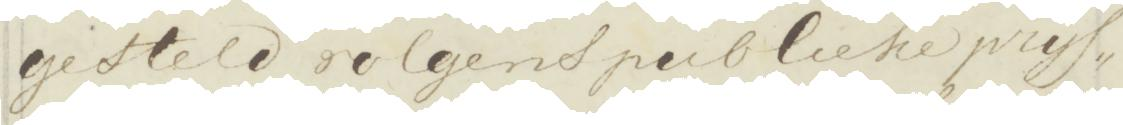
gesteld volgens publieke prys„
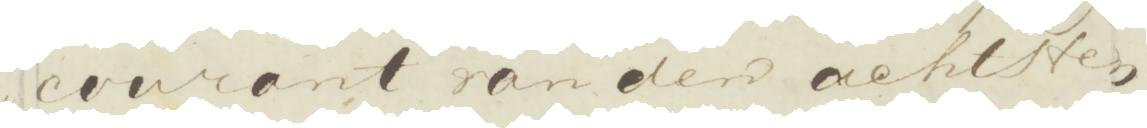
„courant van den achtsten
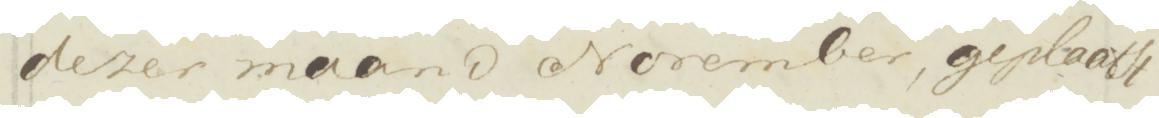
dezer maand November, geplaatst
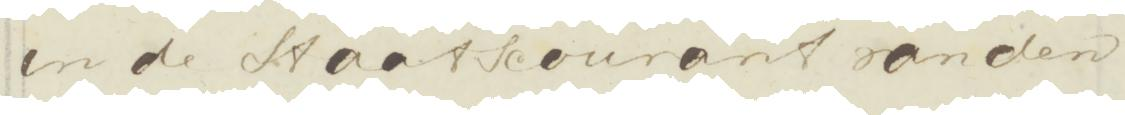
in de staatscourant van den
